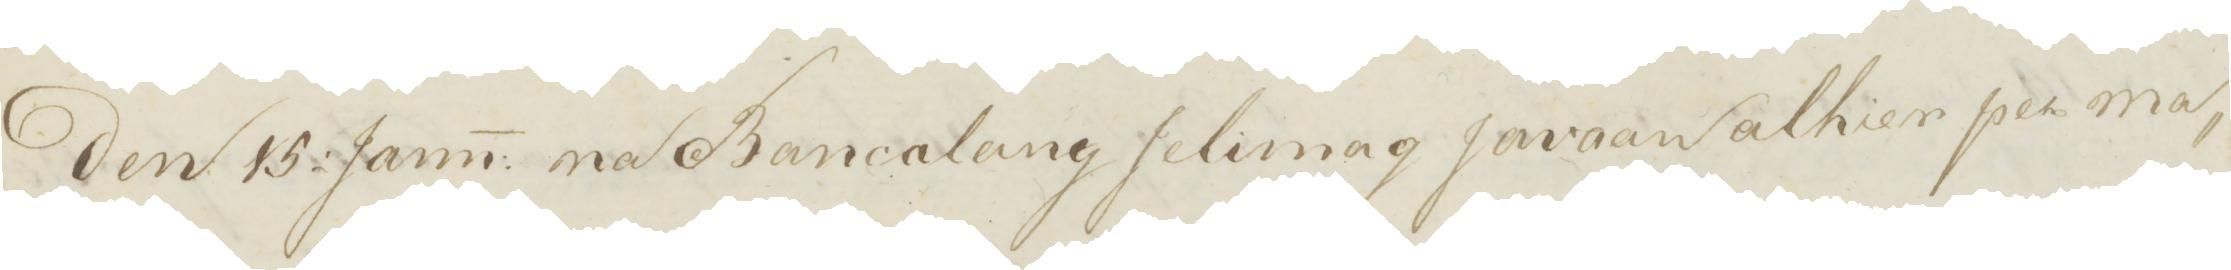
den 15: Jann: na Bancalang selimag Javaan alhier per ma
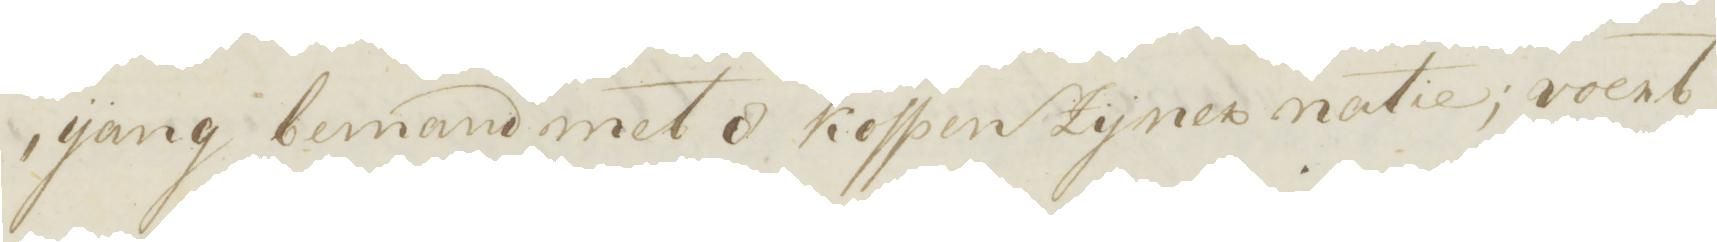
„ijang bemand met 8 koppen zijner natie; voert
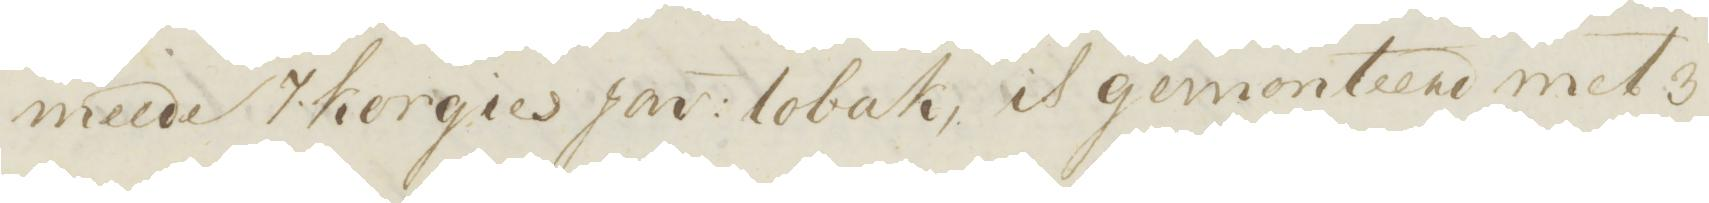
meede 7. korgies jav: tobak, is gemonteerd met 3
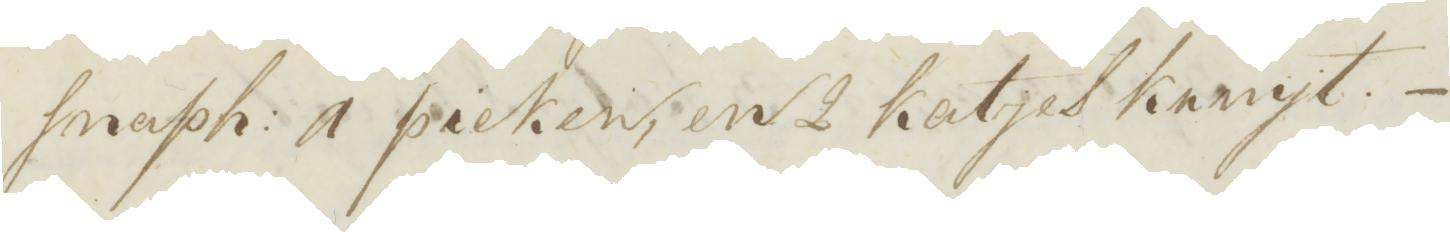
snaph: 4 pieken, en 2 katjes kruijt. —
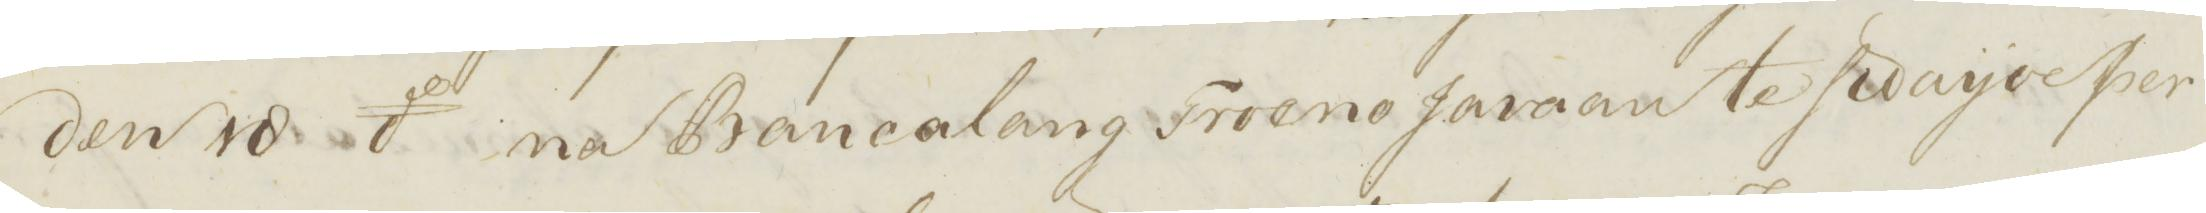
den 18 d=o na Bancalang Troeno Javaan te sidaijoe per
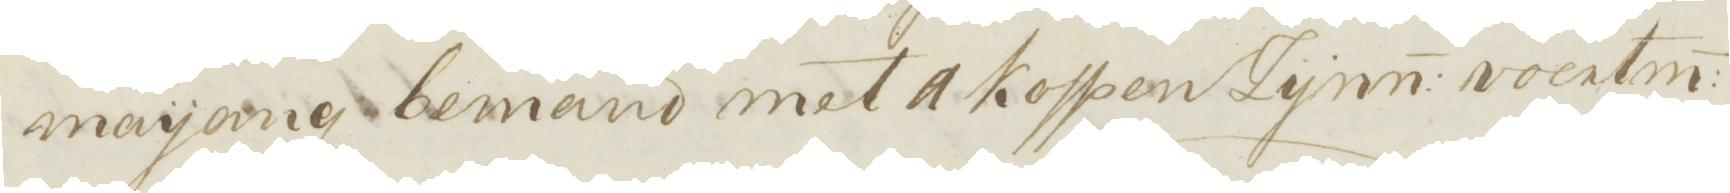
maijang bemand met 4 koppen zijnn: voertm.
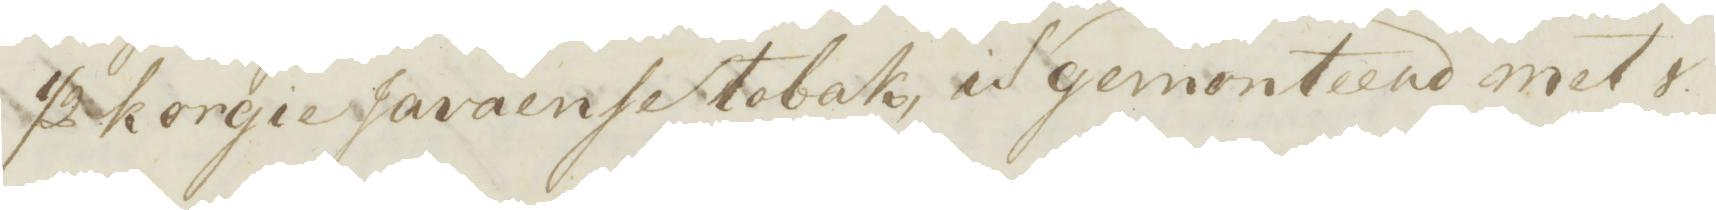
½ korgie Javaense tobak, is gemonteerd met 1.
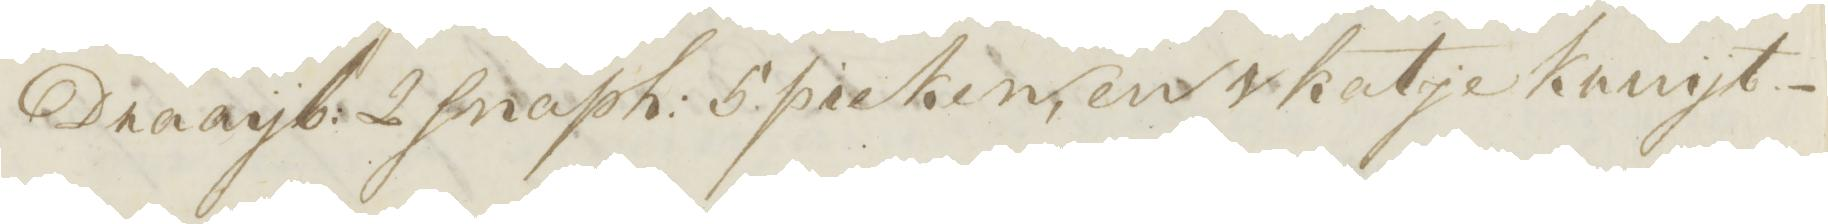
draaijb: 2 snaph: 5. pieken, en 1 katje kruijt. —
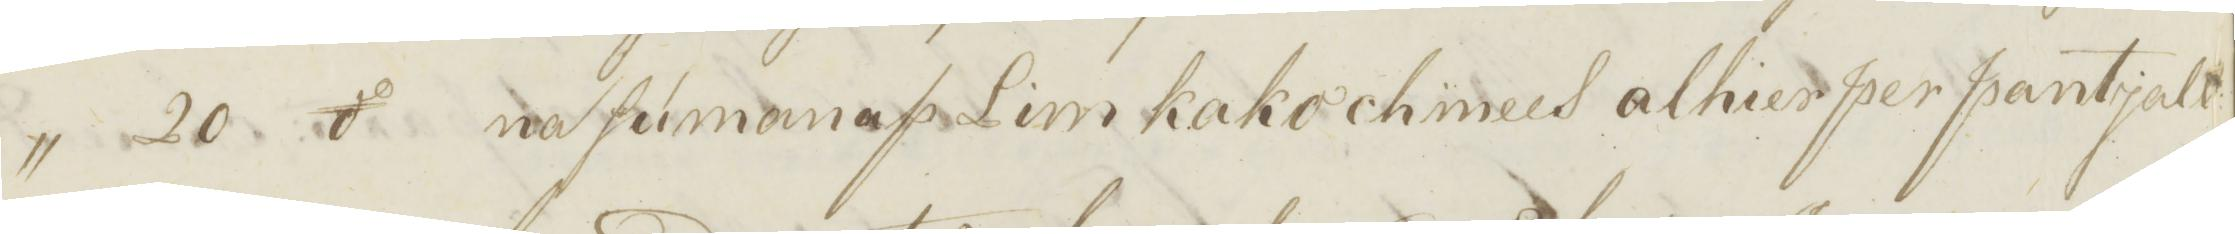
„ 20 d„o na sumanap Lim kako chinees alhier per pantjall
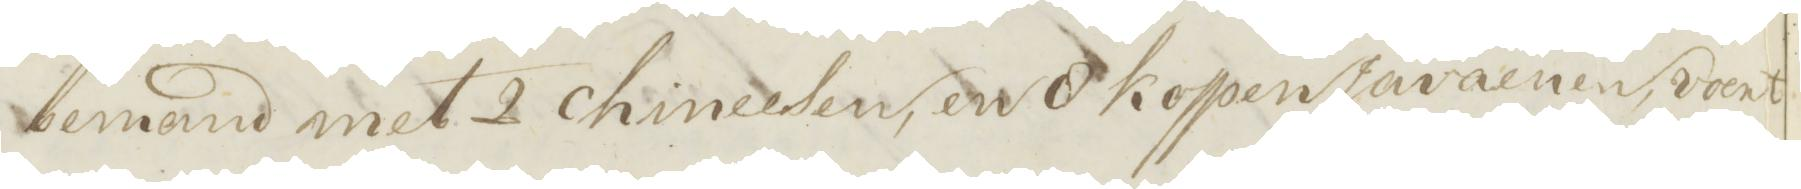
bemand met 2 chineesen, en 8 koppen Javaenen, voert
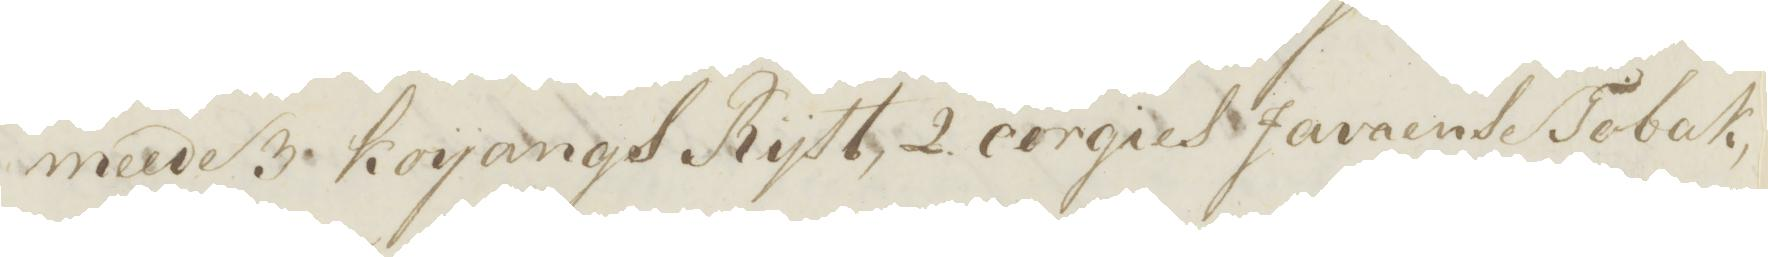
meede 3 koijangs Rijst, 2. corgies Javaense Tobak,
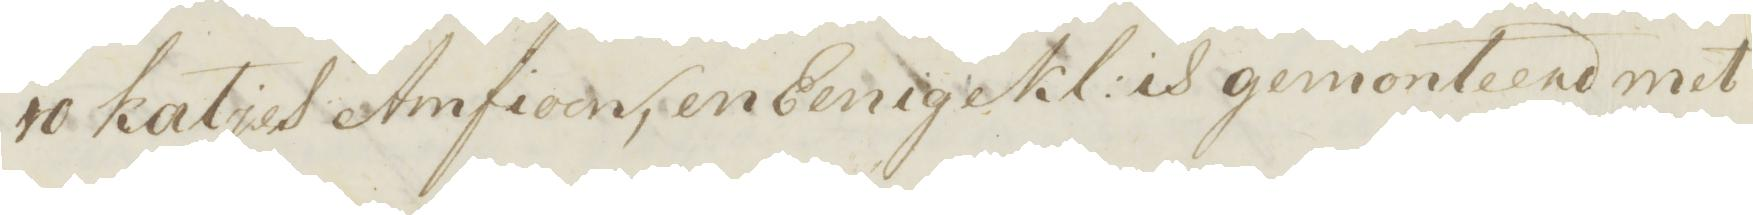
10 katjes Amfioen, en Eenige kl: is gemonteerd met
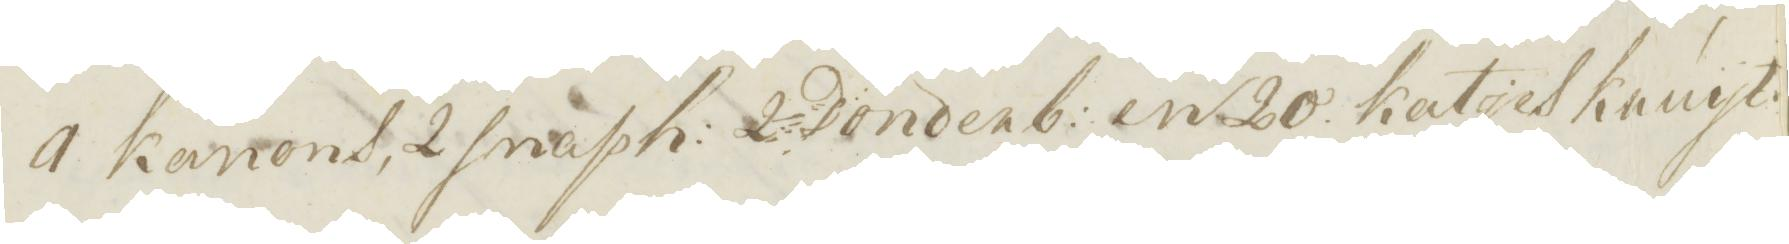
4 kanons, 2 snaph: 2 Donderb: en 20. katjes kruijt.
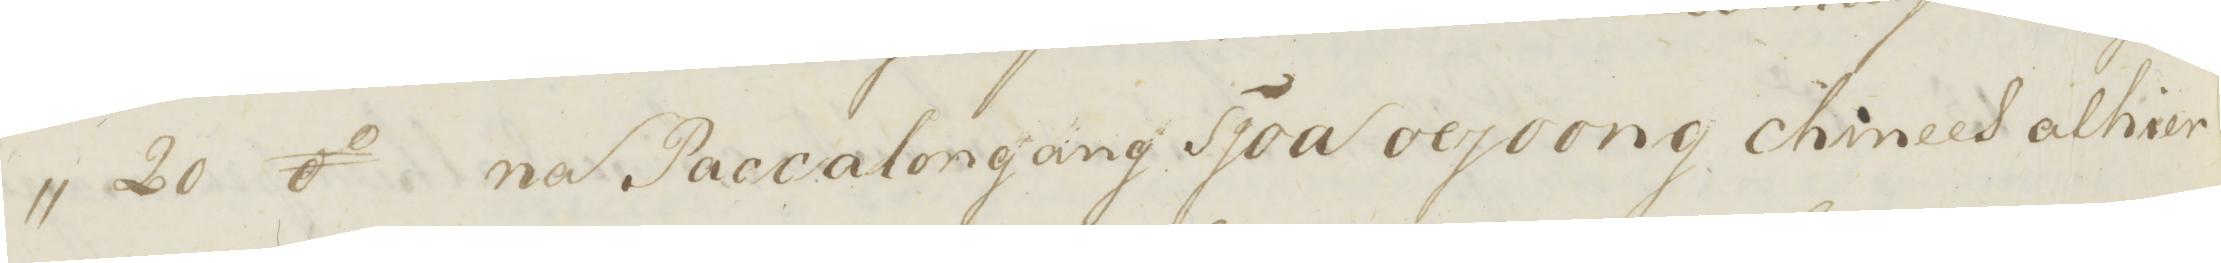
„ 20 d=o na Paccalongang sjoa oejoong chinees alhier
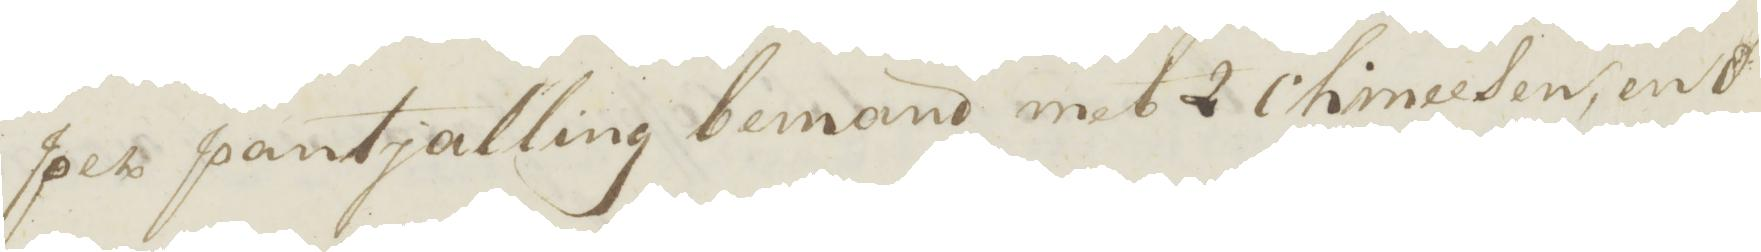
per pantjalling bemand met 2 chineesen, en 8
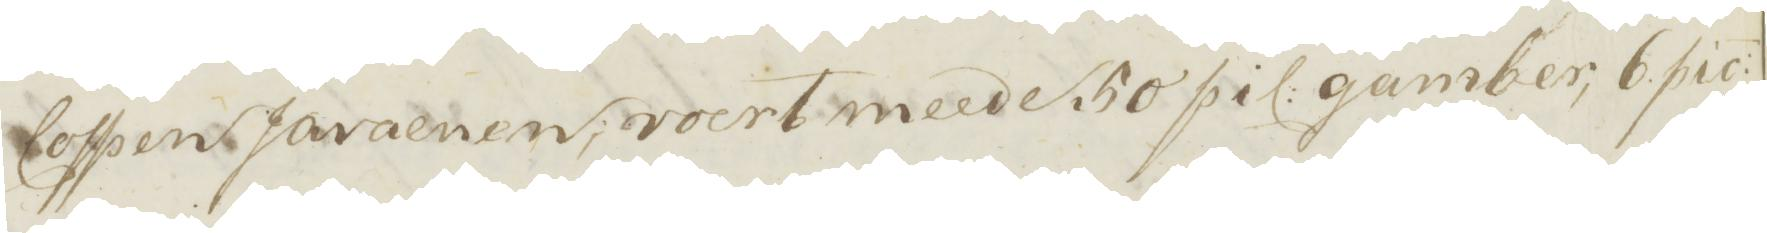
Coppen Javaenen; voert meede 50 pic: gamber, 6. pic:
